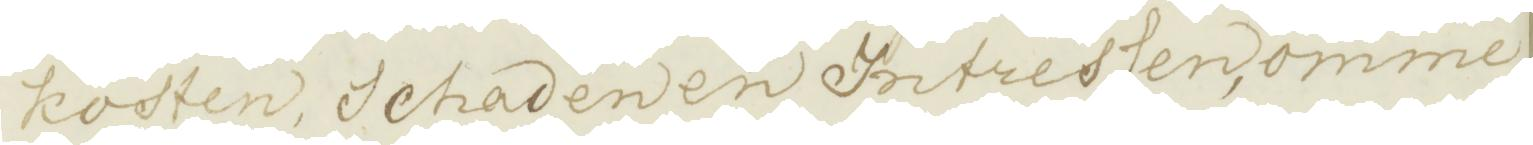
kosten, schaden en Jntressen, omme
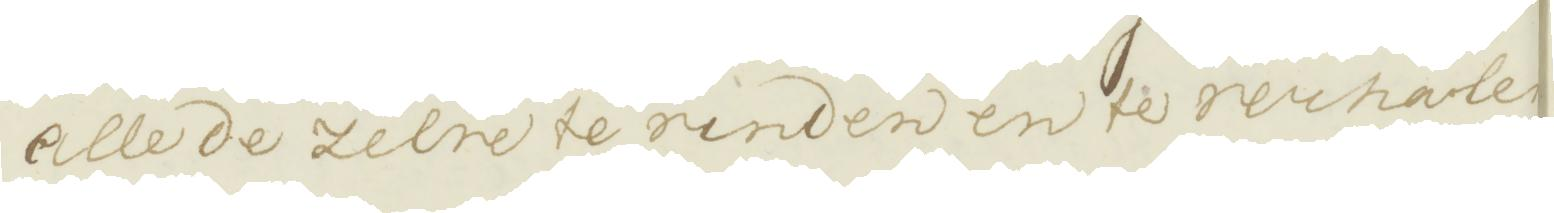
alle de zelve te vinden en te verhale
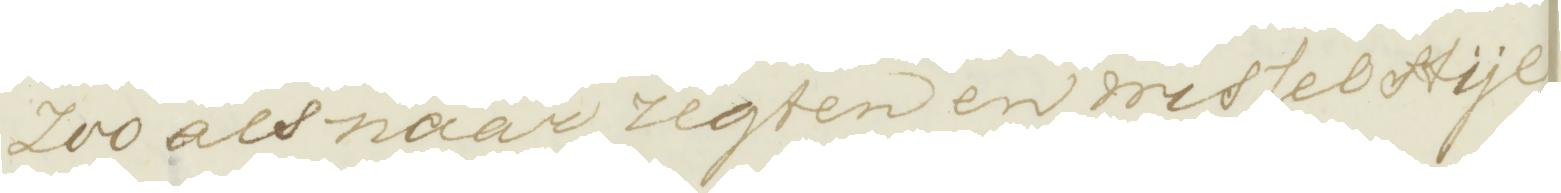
zoo als naar regten en wissel stijl
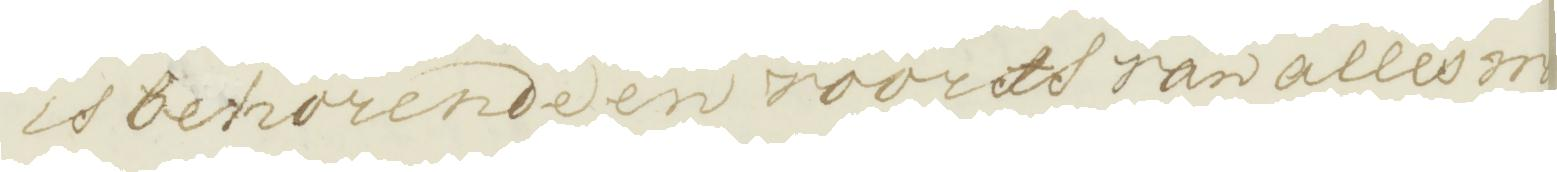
is behorende, en voorts van alles w
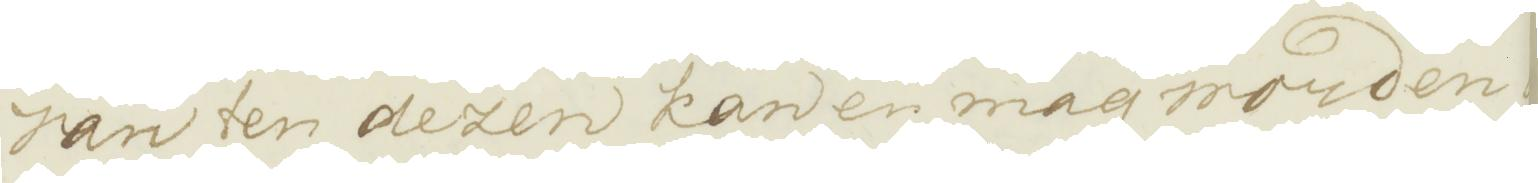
van ten dezen kan en mag worden
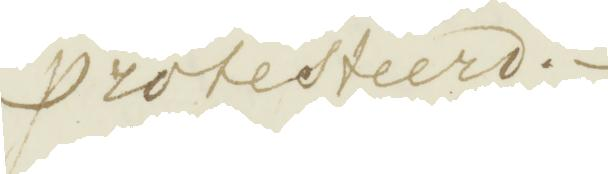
protesteerd.
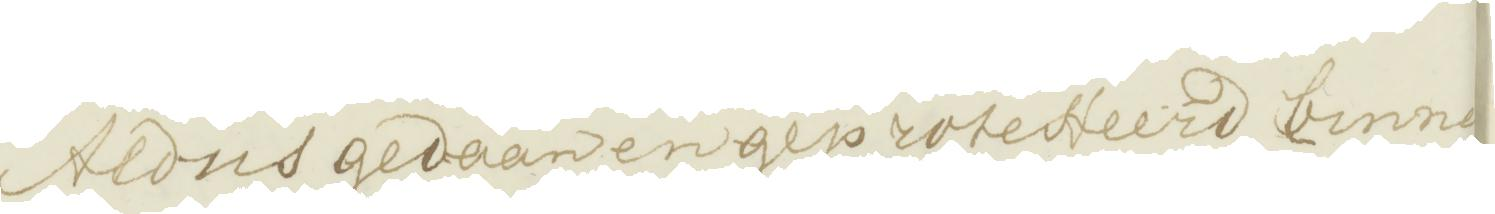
Aldus gedaan en geprotesteerd binne
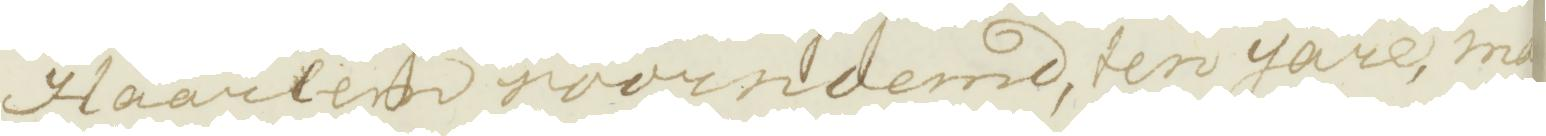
Haarlem voornoemd, ten Jare, ma
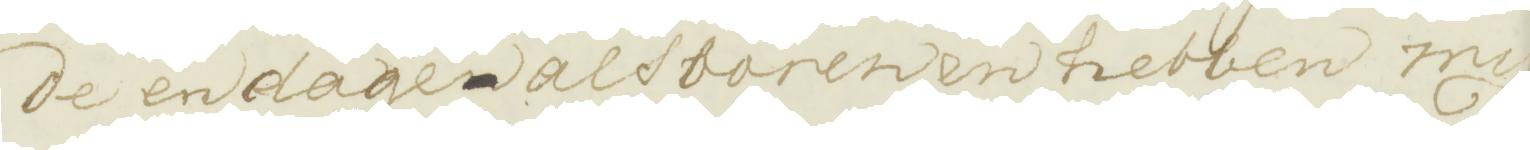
de en dagen als boven en hebben wy
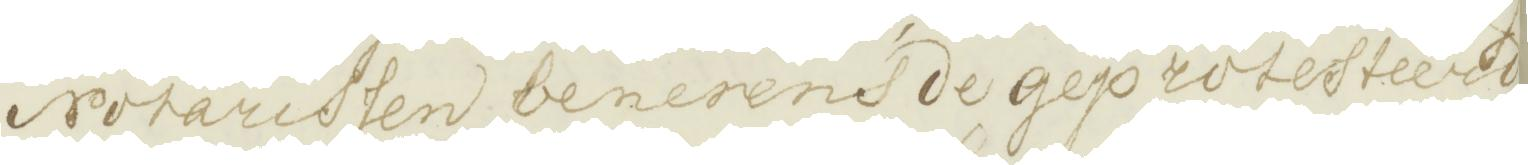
Notarissen, benevens de geprotesteerd
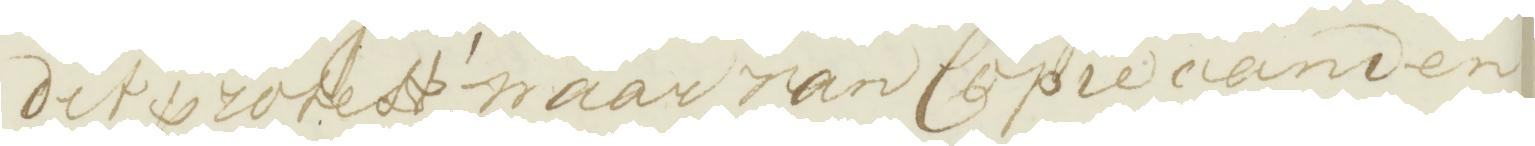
dit protest, waar van Copie aanden
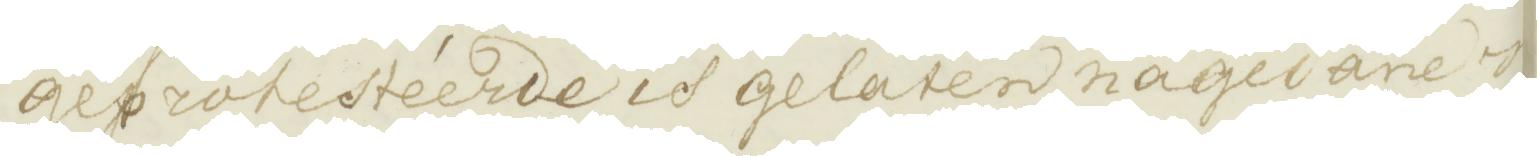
geprotesteerde is gelaten, nagedane v
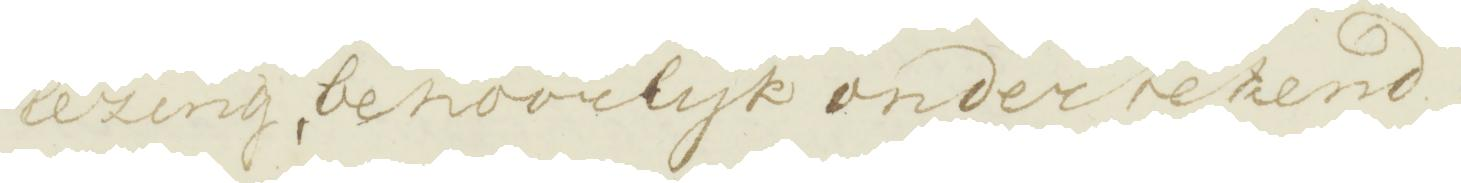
lezing, behoorlyk ondertekend.
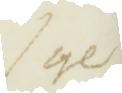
/ ge
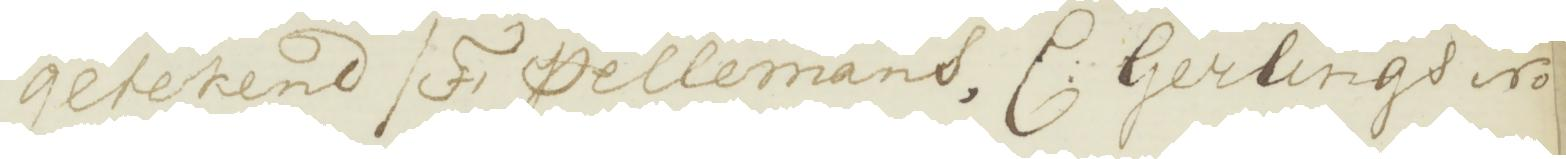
getekend / Fr Pellemans, C: Gerlings No
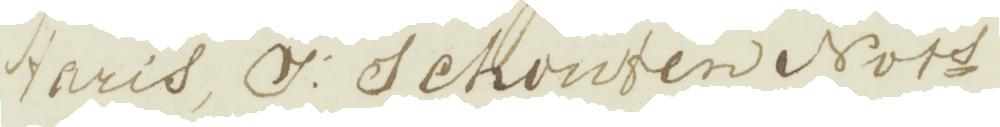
taris, J: Schouten Not=s
